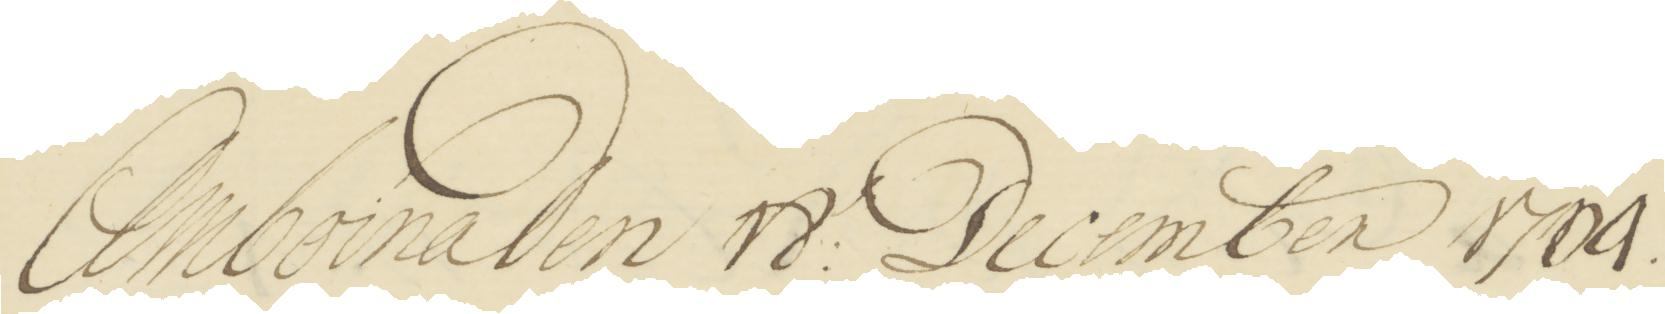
Amboina den 18: December 1704.
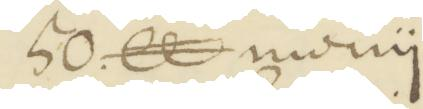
50. lb menij
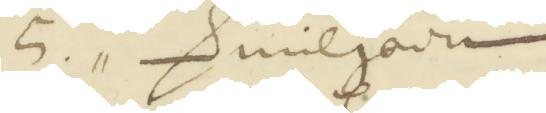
5. „ vermiljoen
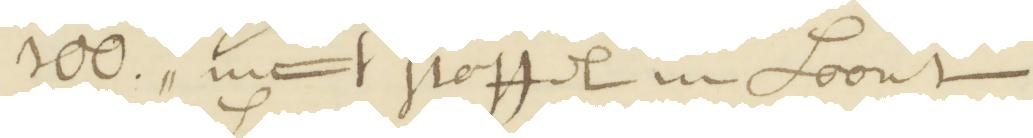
100. „ inct stoffel in soort
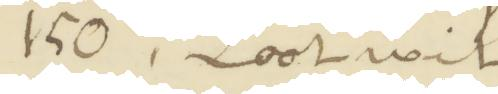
150 „ Loot wit
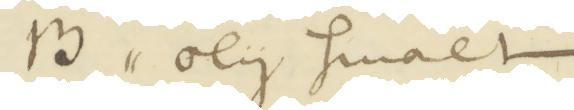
13 „ olij smalt
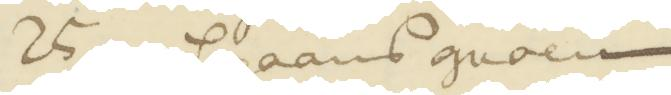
25. „ spaans groen
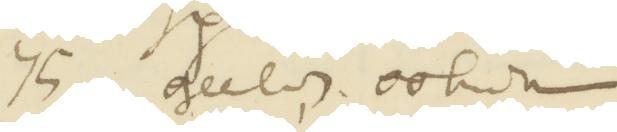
75 „ geelen ooker
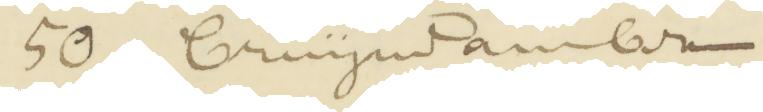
50 „ bruijne amber
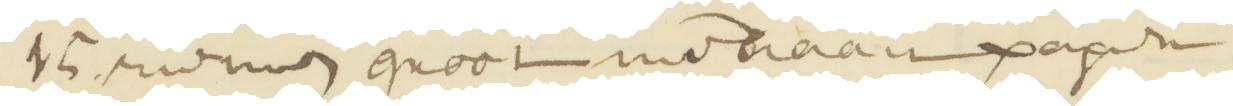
15. riemen groot mediaan papier
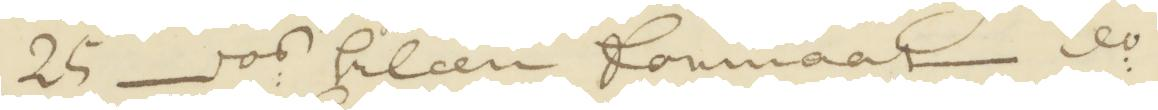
25 _os: kleen formaat do:
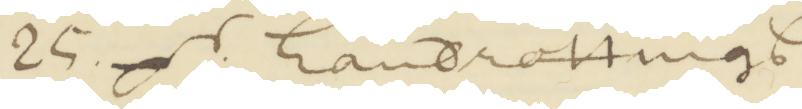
25. p:s handrottings
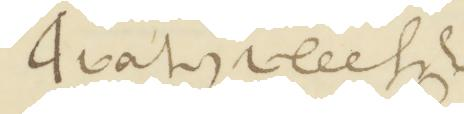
4 vaten vleesch
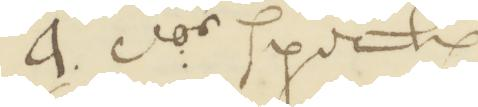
4. D:os speck
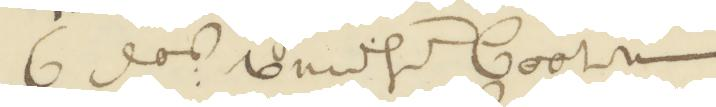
6 d:os vriese booter
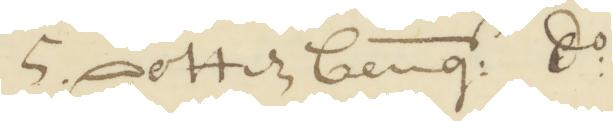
5. potten beng:s d:o
